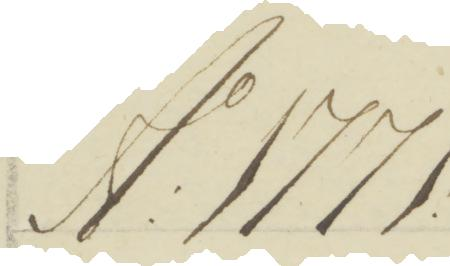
A:o 1771
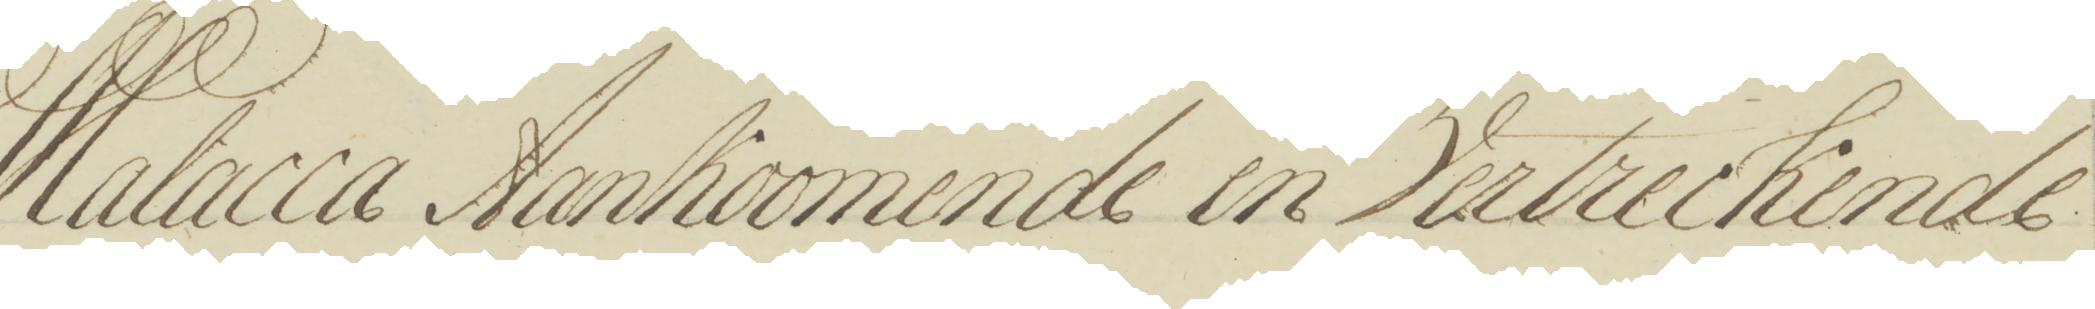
Malacca Aankoomende en Vertreckende.
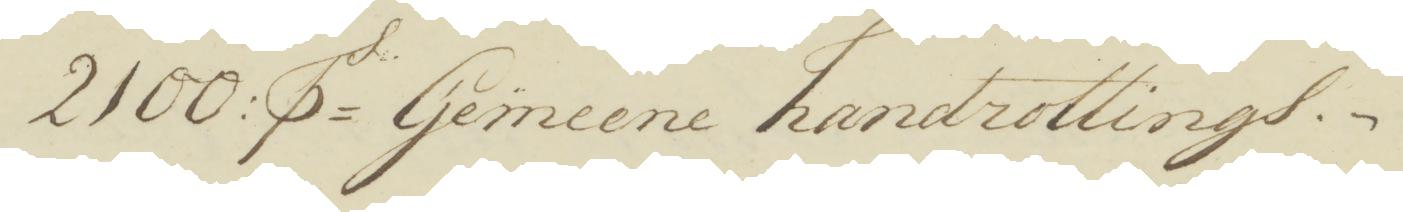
2100: p=s Gemeene handrottings:
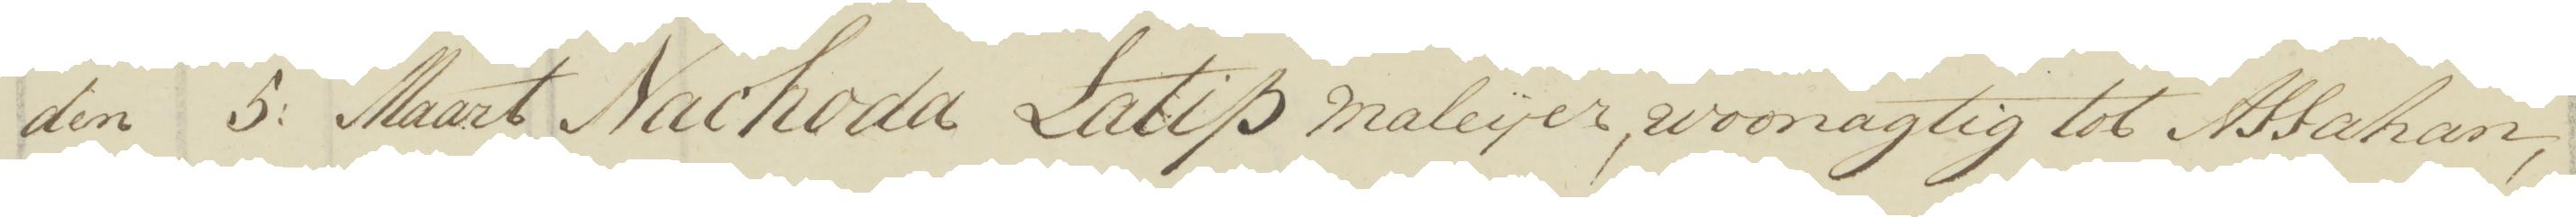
den 3: Maart Nachoda Latip maleijer, woonagtig tot Assahan,
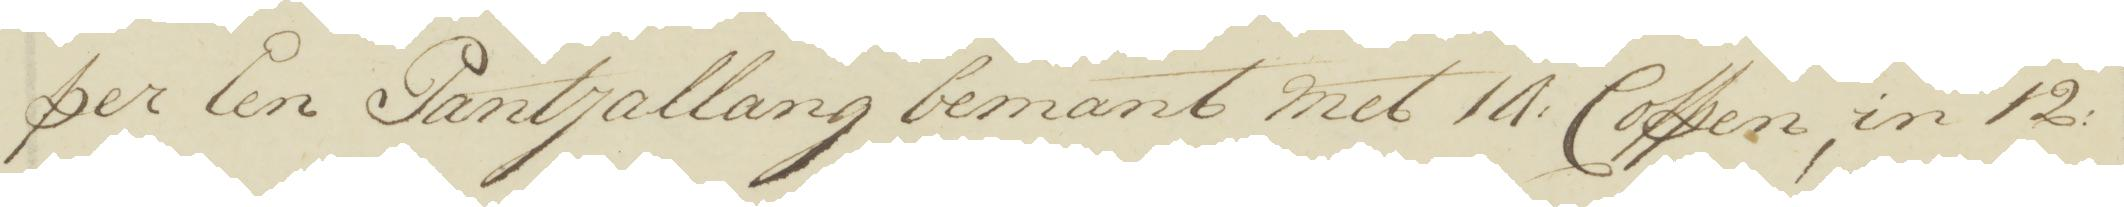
per Een Pantjallang bemant met 14: coppen, in 12:
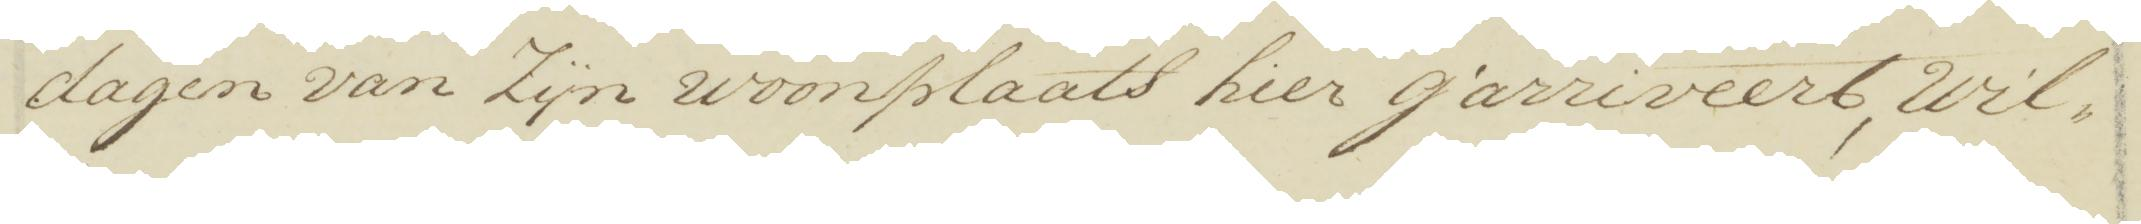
dagen van zijn woonplaats hier g'arriveert, wil„
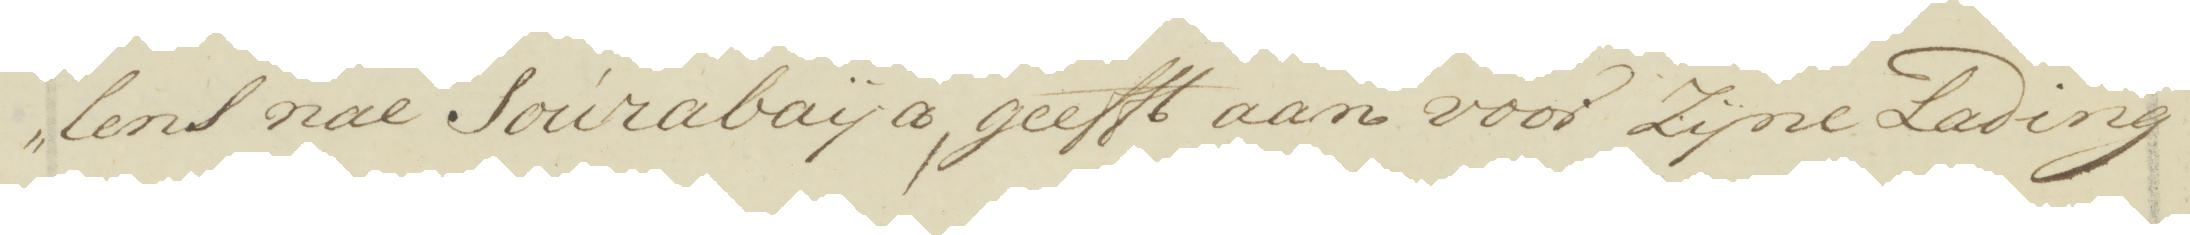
„lens nae Sourabaija, geefft aan voor zijne Lading
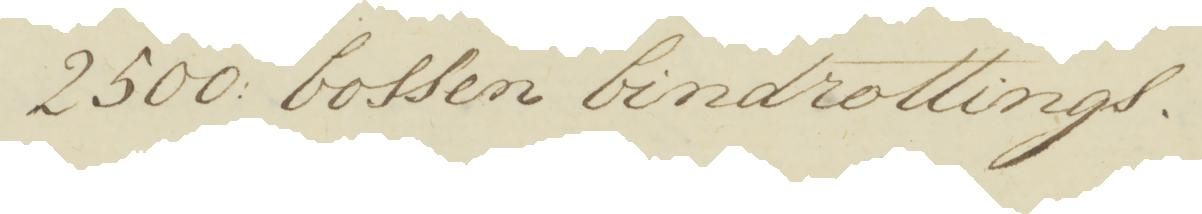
2500: bossen bindrottings.
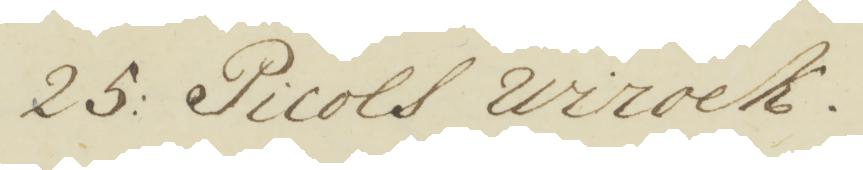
25: Picols wiroek.
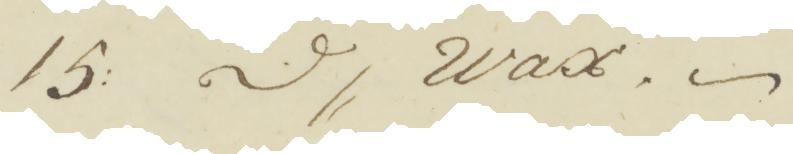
15: d„ wax.—
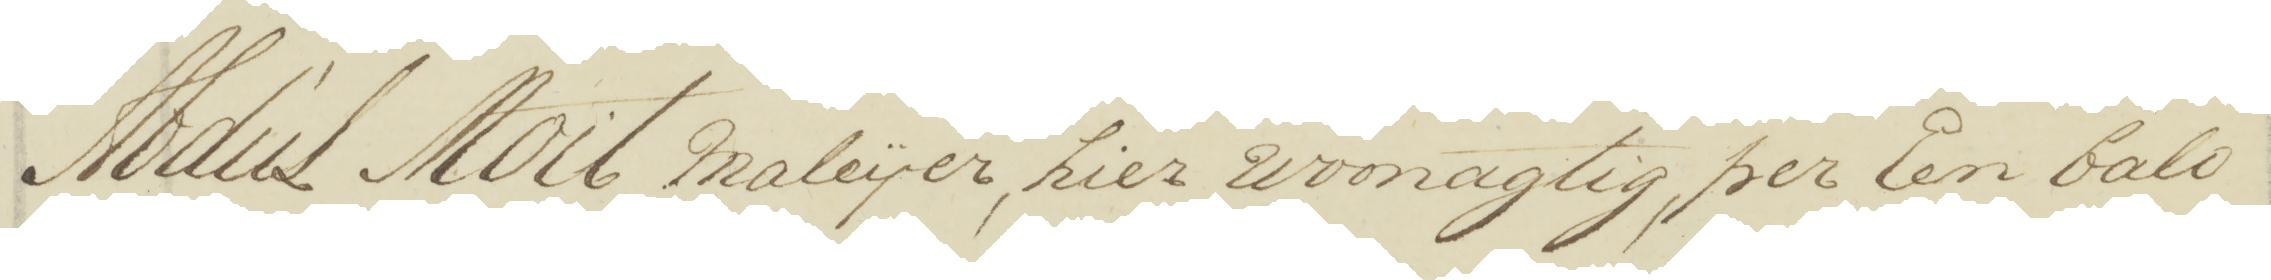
Abdul Moit maleijer, hier woonagtig, per Een balo
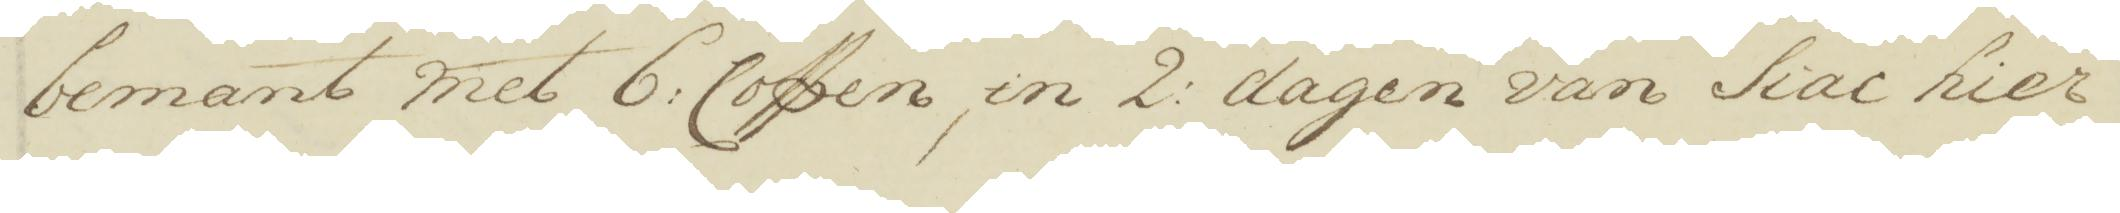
bemant met 6: coppen, in 2: dagen van siac hier
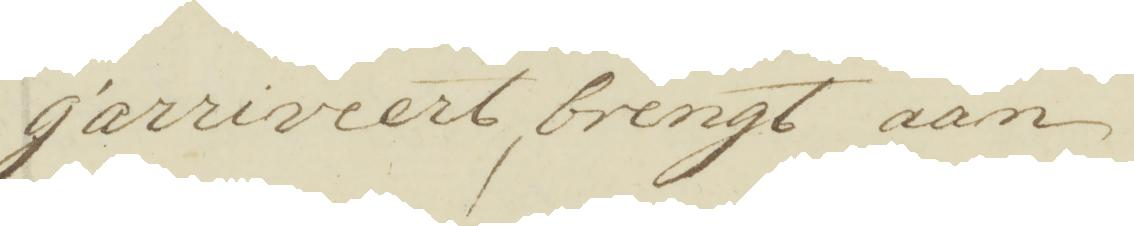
g'arriveert brengt aan
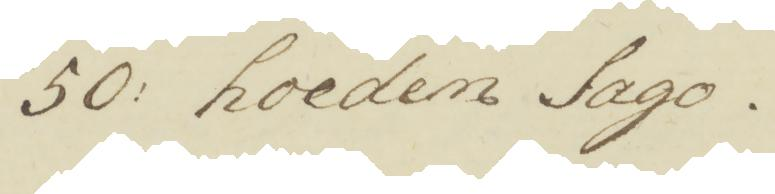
50: hoeden sago.
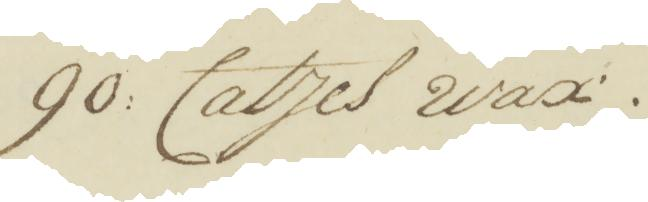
90: catjes wax.
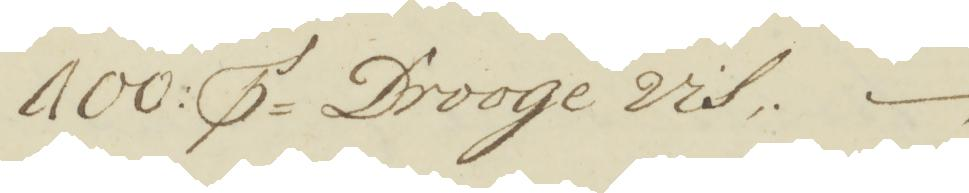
400: p=s Drooge vis.
